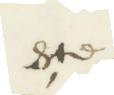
,ste
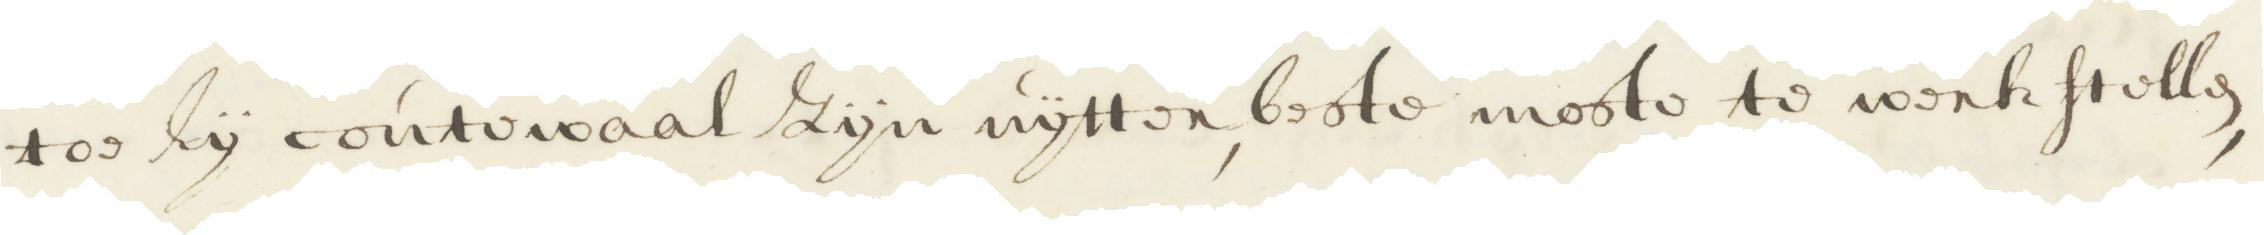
toe hij coutewaal zijn uijtter, beste moste te werk stellen,
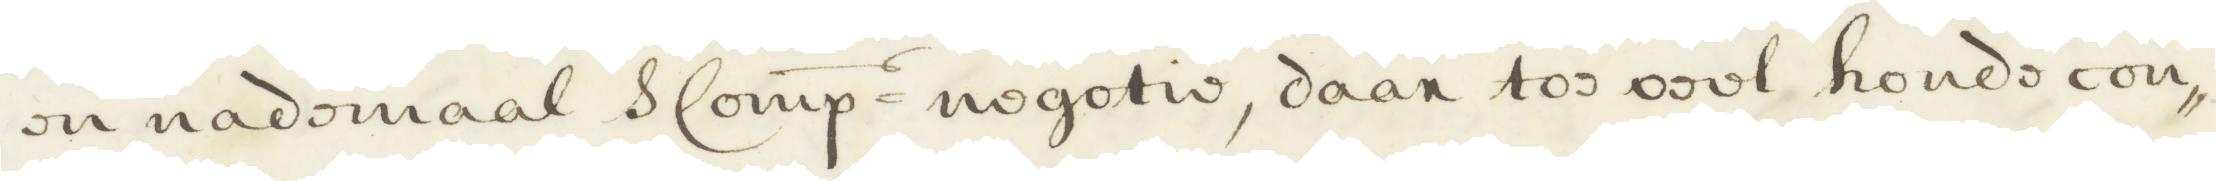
en nademaal s Comp=s negotie, daar toe veel konde con„
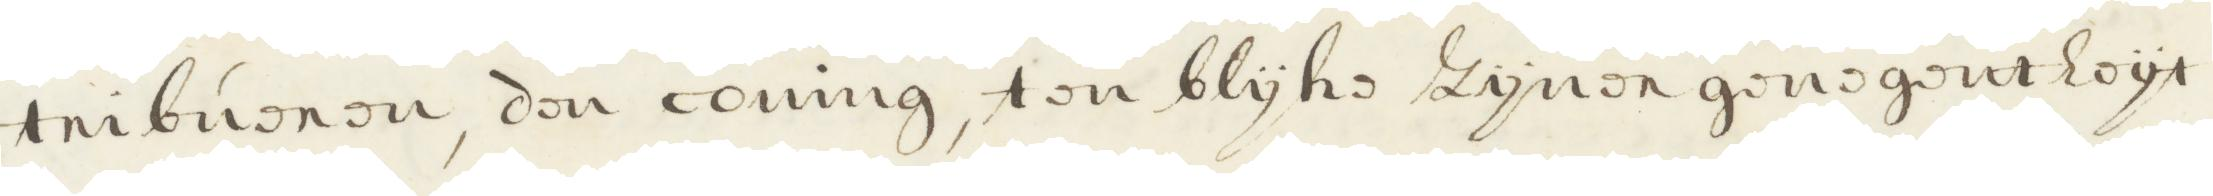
tribueren, den coning, ten blijke zijner genegentheijt
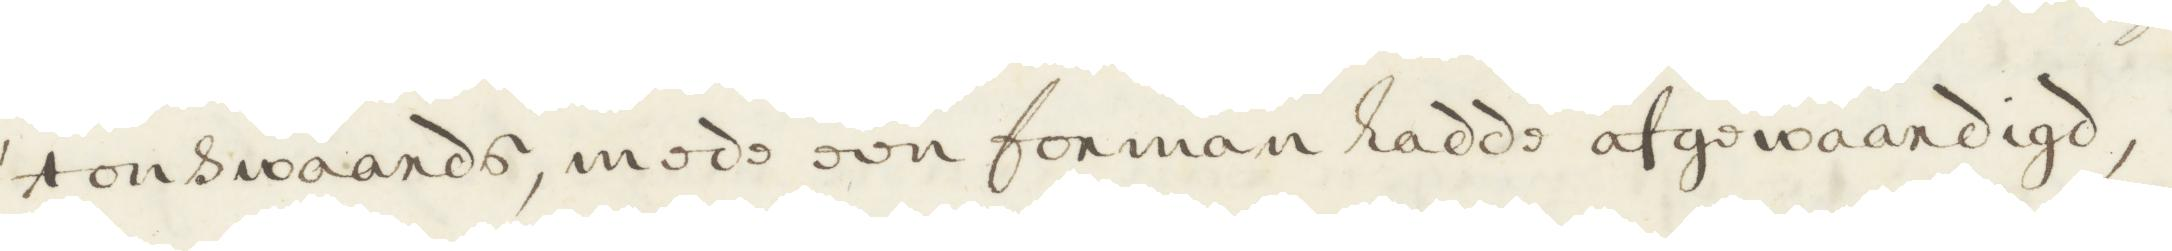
't onswaards, mede een forman hadde afgewaardigd,
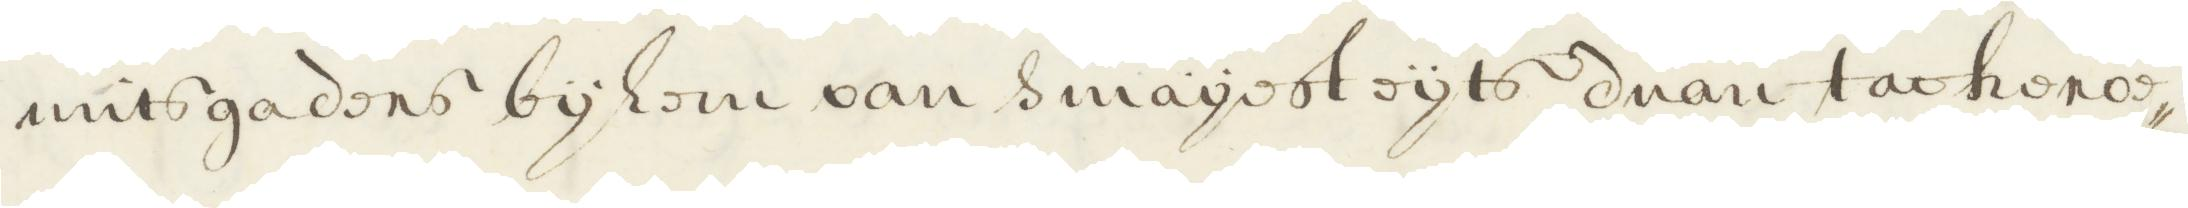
mitsgaders bijhem van s maijesteijts duan tackeroe„
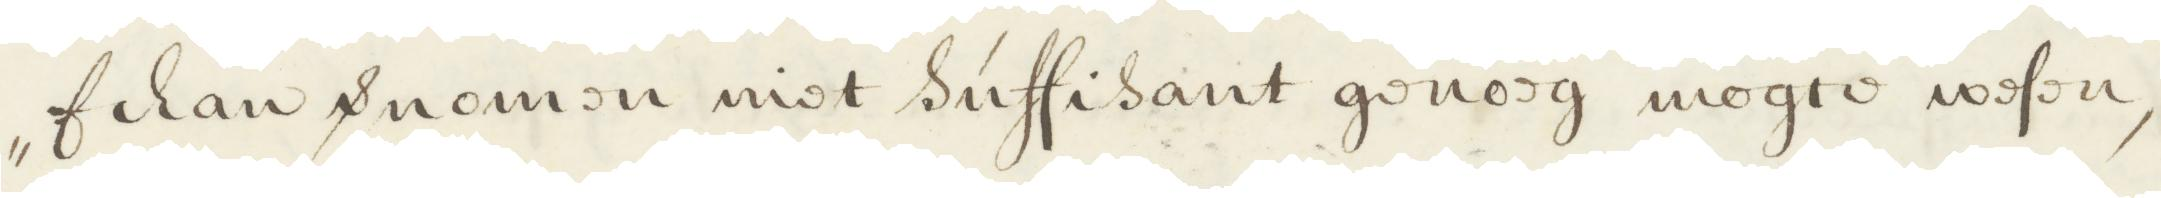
„f chan vernomen niet suffisant genoeg mogte wesen,
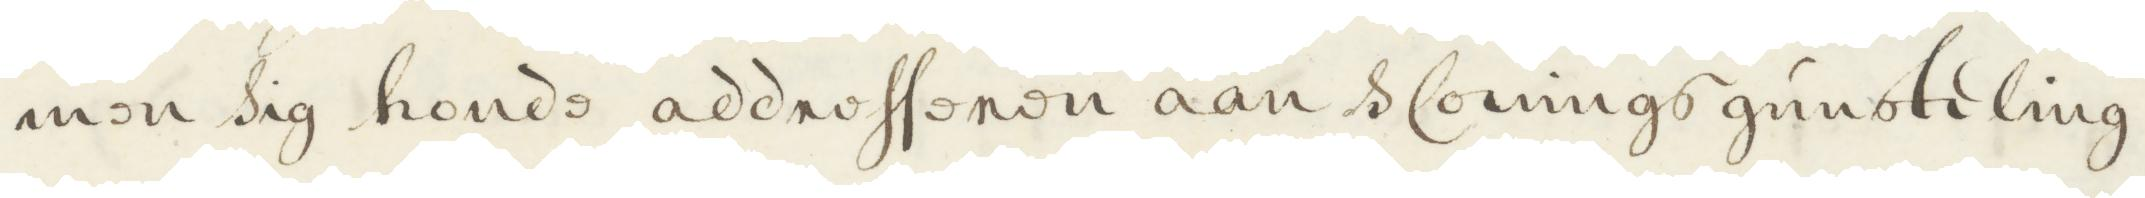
men sig konde addresseren aan s Conings gunsteling
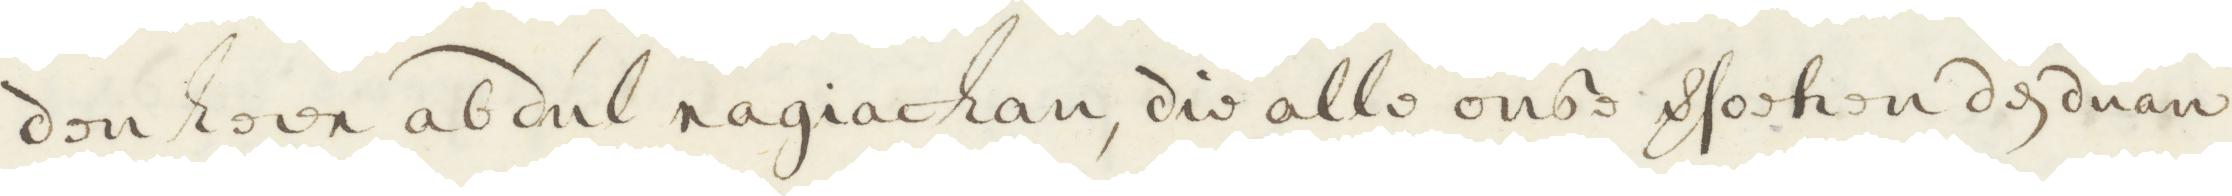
den heer abdul ragiachan, die alle onse versoeken den duan
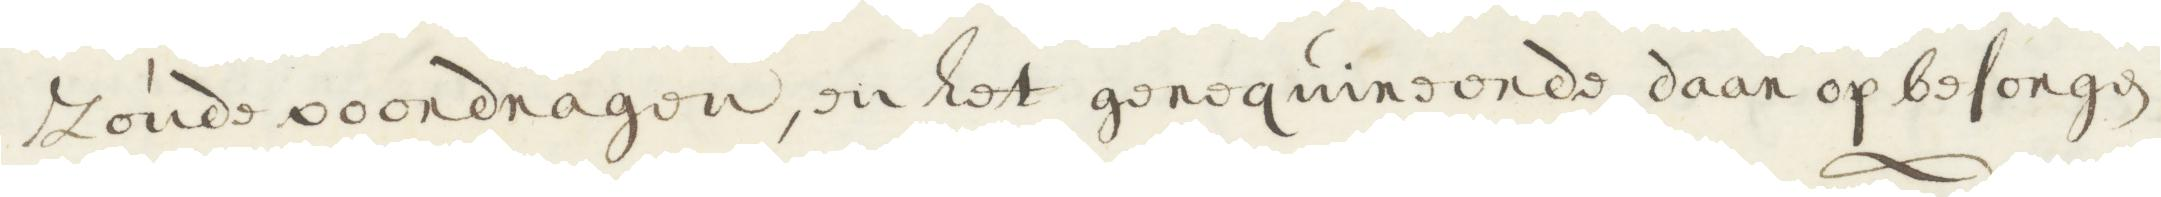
zoude voordragen, en het gerequireerde, daar op besorgen
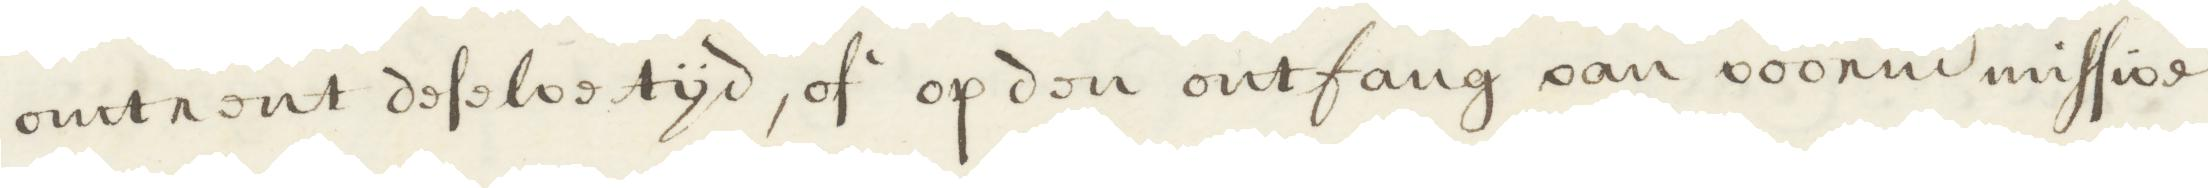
omtrent deselve tijd, of op den ontfang van voorm missive
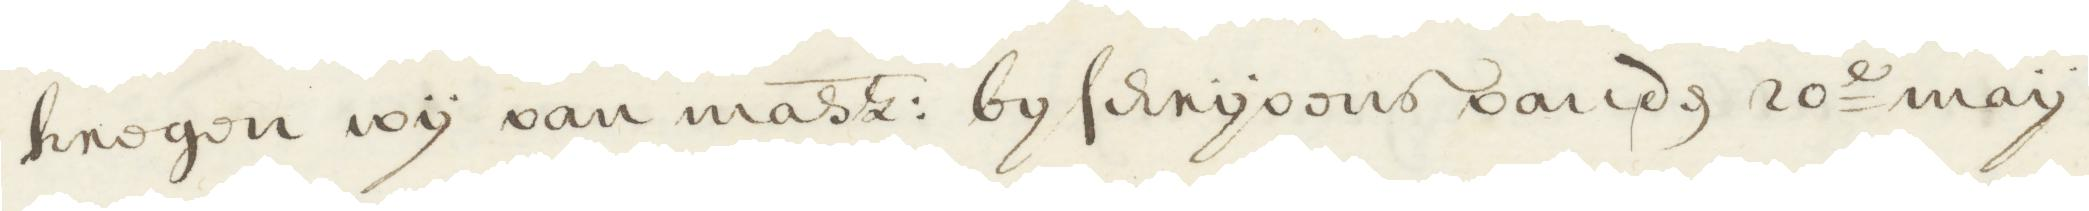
kregen wij van masz: by schrijvens van den 20=e maij
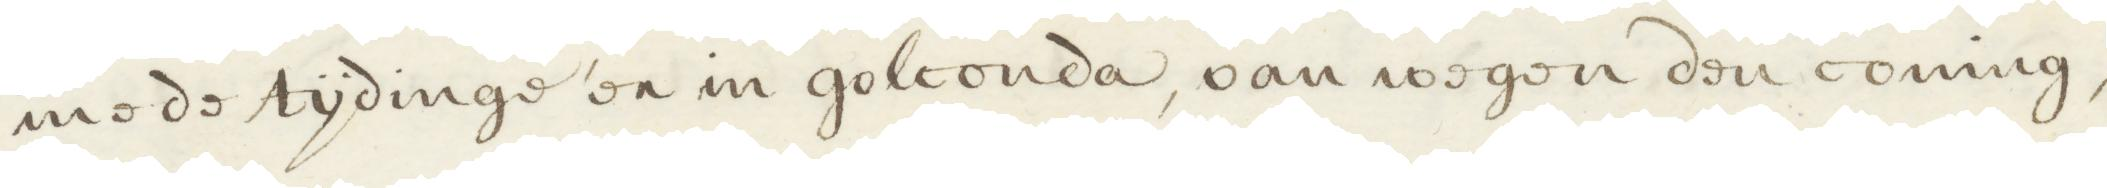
mede tijdinge 'er in golconda, van wegen den coning
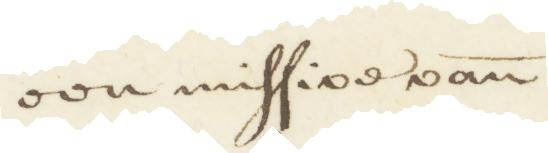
een missive van
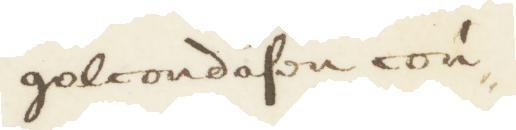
golcondasen cou„
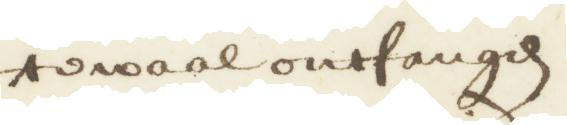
tewaal ontfangen
